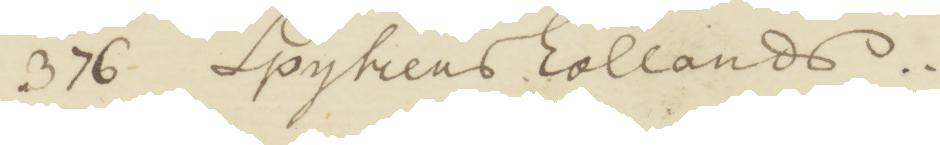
376 spykers hollands ..
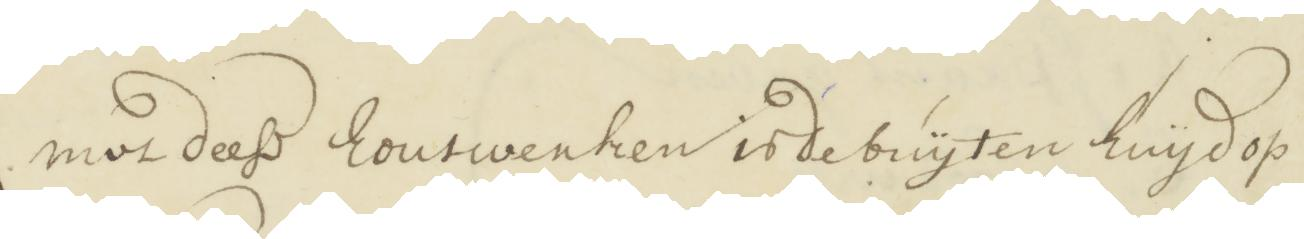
met deese houtwerken is de buijten huijd op
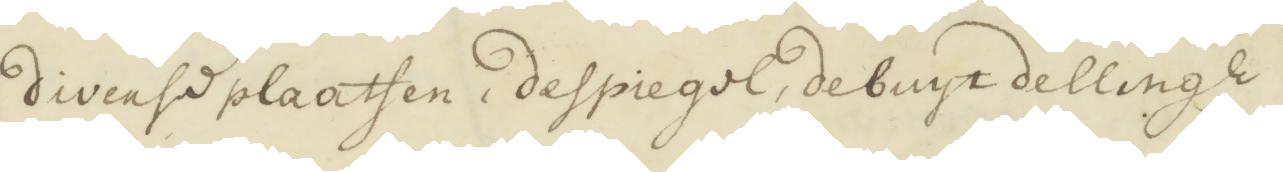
diverse plaatsen, de spiegel, de buyt dellingh
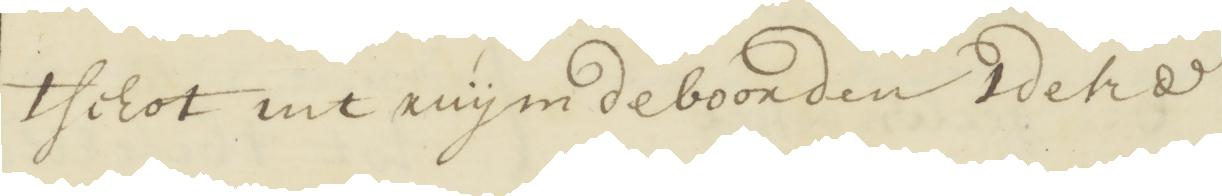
tschot in't ruijm de boorden idem de
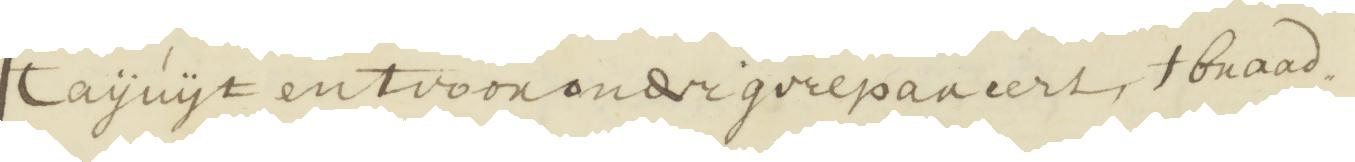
Caijuijt en t vooronder gerepareert, t braad„
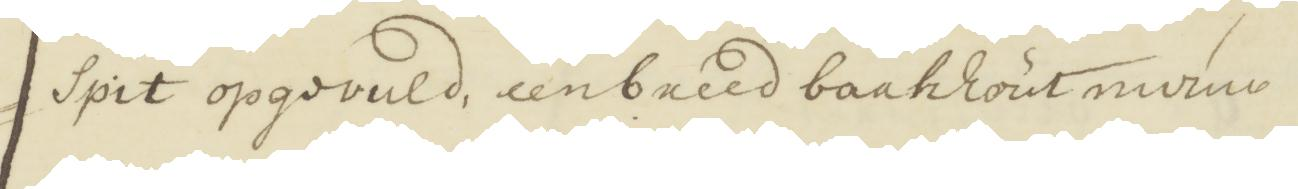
spit opgevuld, een breed baakhout nieuw
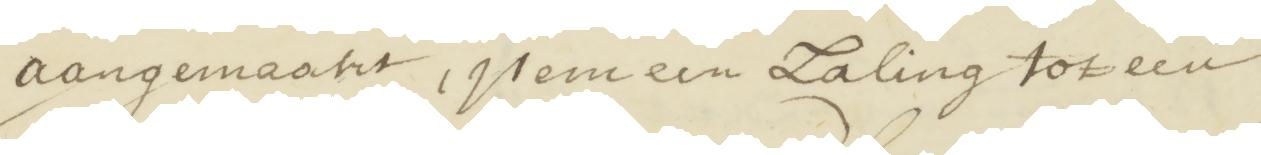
aangemaakt, jtem een zaling tot een
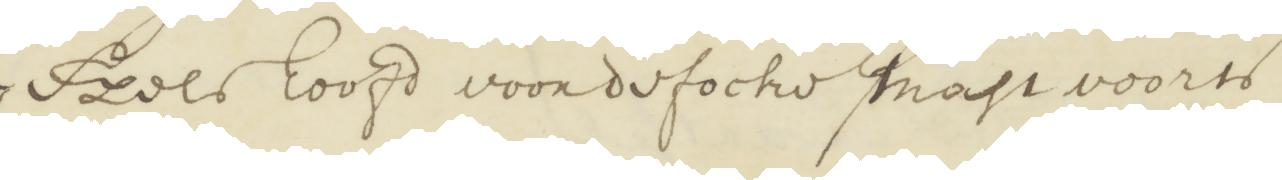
Ezelshoofd voor de focke mast voorts
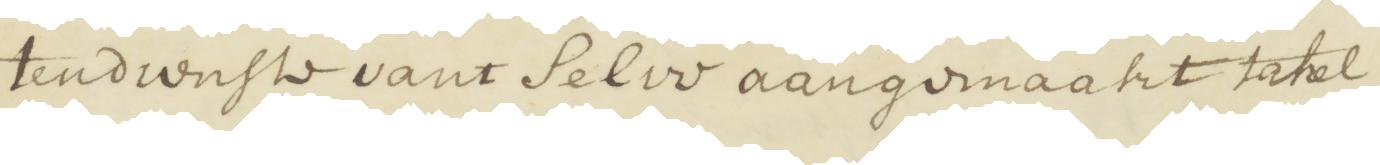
ten dienste vant selve aangemaakt takel
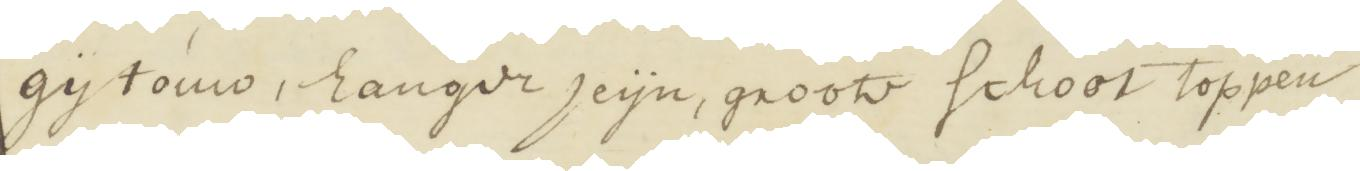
gij touw, hanger jeijn, groote schoot toppen
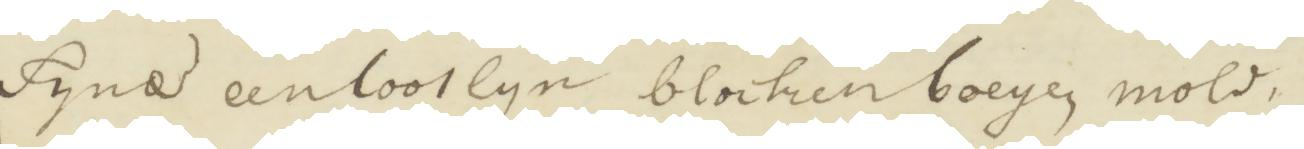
Eynde een lootlyn blocken boeyen mole,
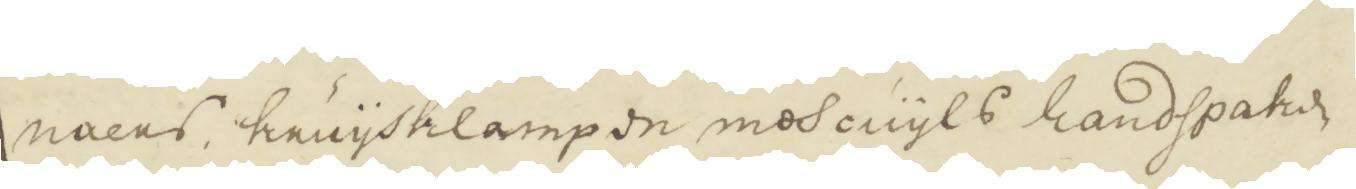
naers, kruijsklampen moscuijls handspaken
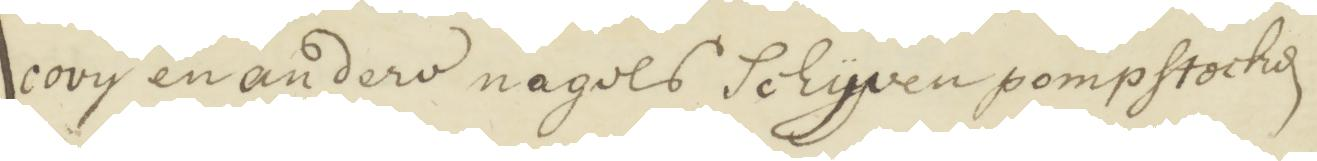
covy en andere nagels schijven pompstocken
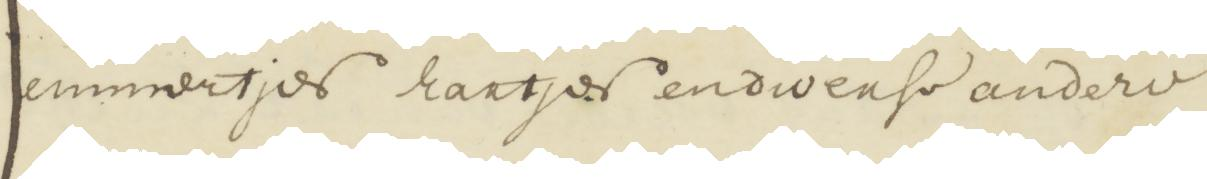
emmertjes hartjes en diverse andere
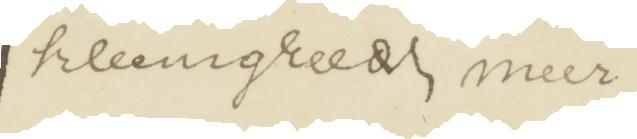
kleenigheeden meer
